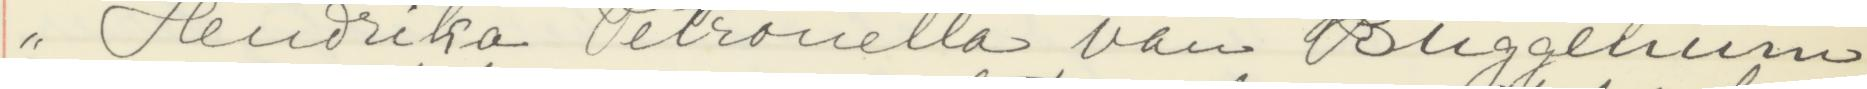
„ Hendrika Petronella van Buggenum
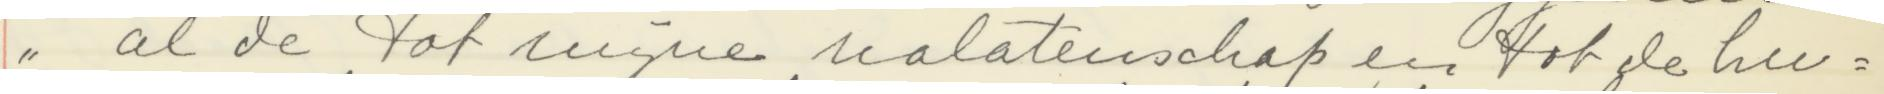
„ al de tot mijne nalatenschap en tot de hu=
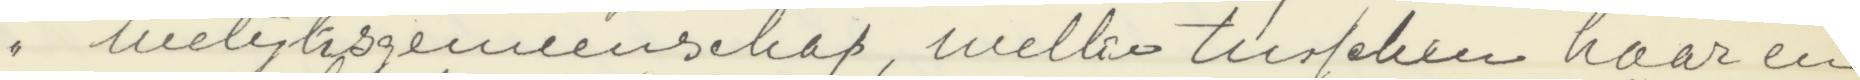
„ welijksgemeenschap, welke tusschen haar en
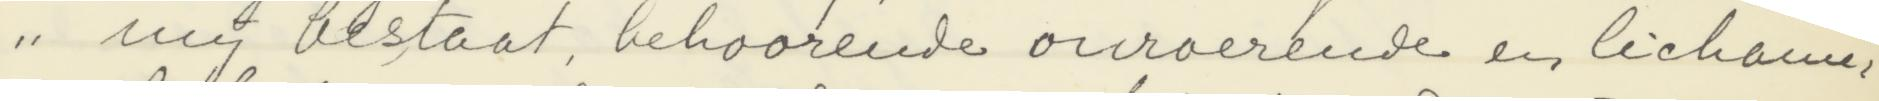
„ mij bestaat, behoorende onroerende en lichame=
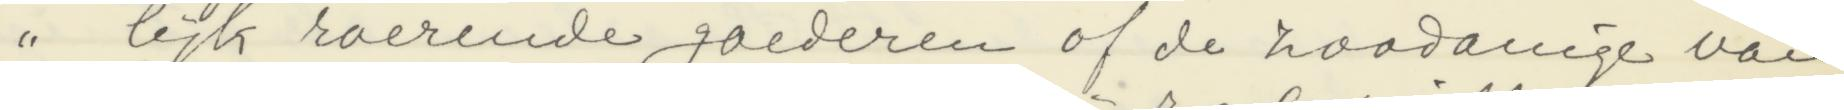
„ lijk roerende goederen of de zoodanige van
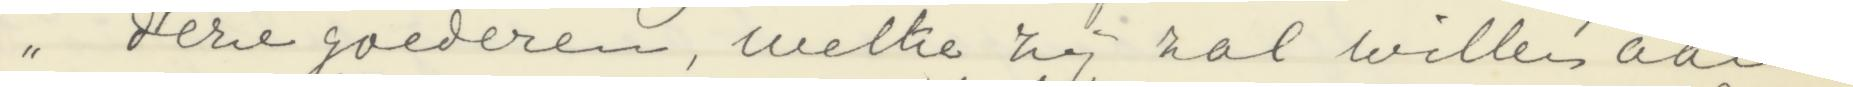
„ deze goederen, welke zij zal willen aan=
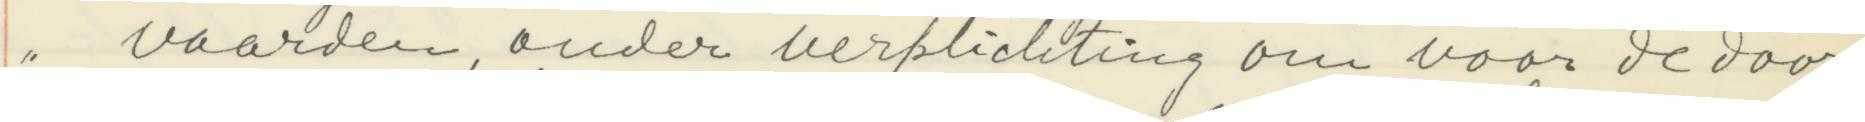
„ vaarden, onder verplichting om voor de door
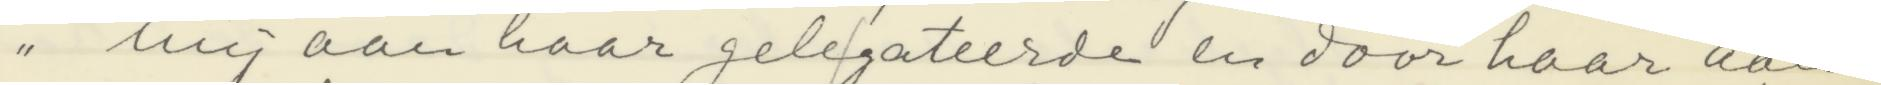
„ mij aan haar gelegateerde en door haar aan=
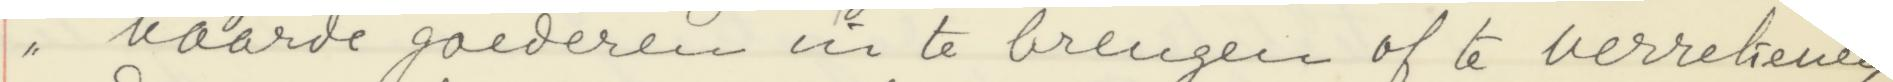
„ vaarde goederen in te brengen of te verrekenen
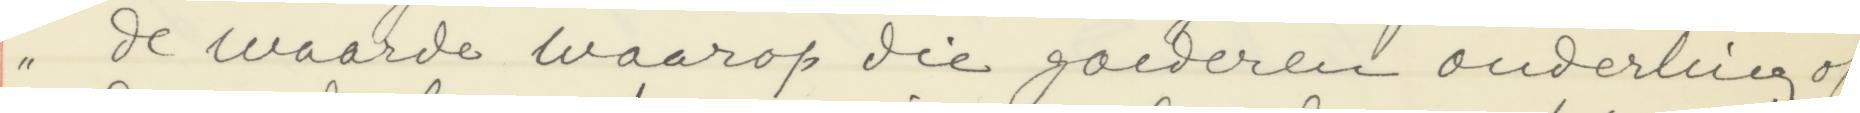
„ de waarde waarop die goederen onderling of
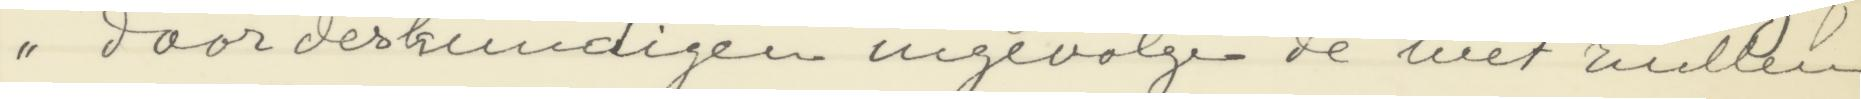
„ door deskundigen ingevolge de wet zullen
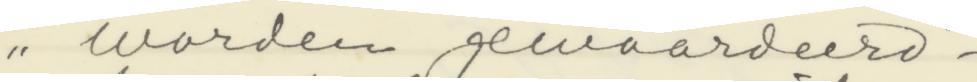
„ worden gewaardeerd -
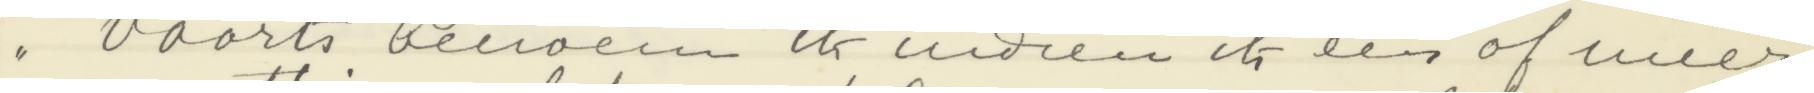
„ voorts benoem ik indien ik een of meer
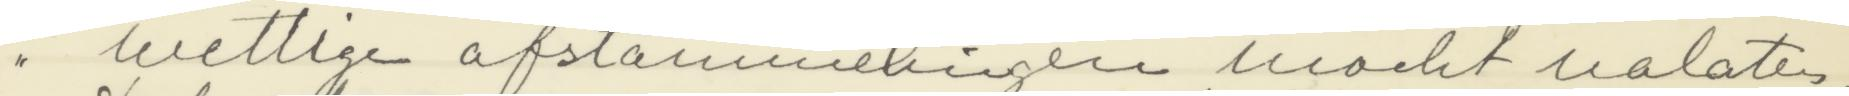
„ wettige afstammelingen mocht nalaten
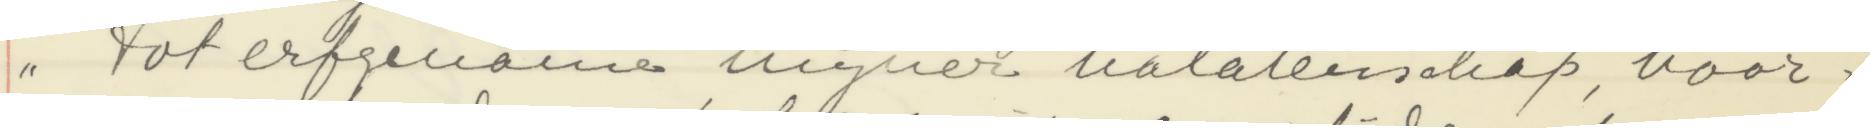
„ tot erfgenaeme mijner nalatenschap, voor=
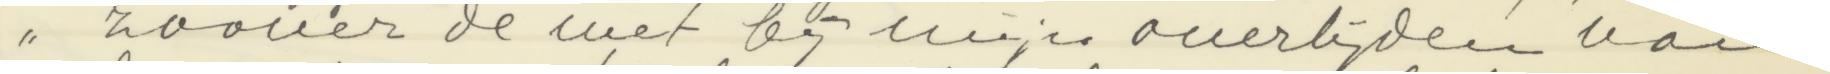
„ zoover de wet bij mijn overlijden van
